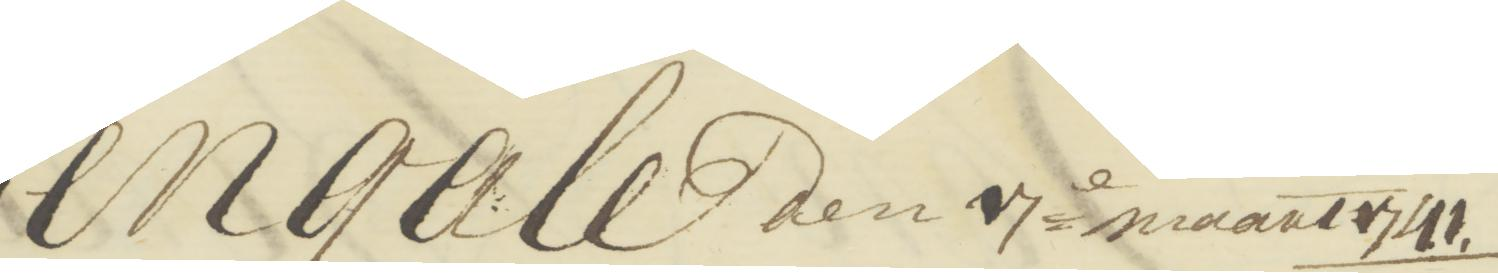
Van Bengele den 17=e maart 1741.
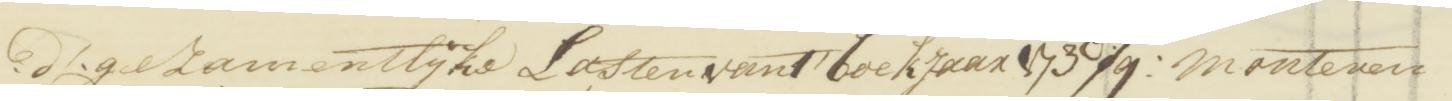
d'gezamentlijke Lasten vant' boekjaar 1738/9: monteren
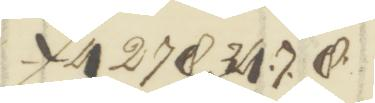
ƒ427834.7.8.
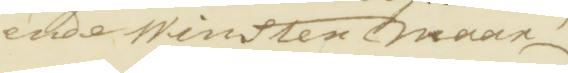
ende winsten maar
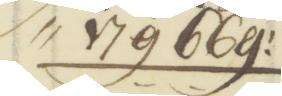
„ 179669
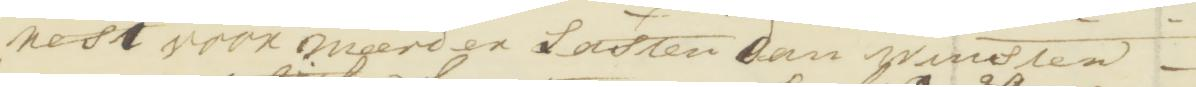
rest voor meerder Lasten dan winsten
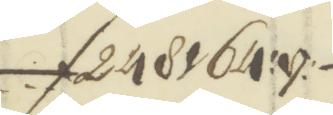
ƒ248164:17:
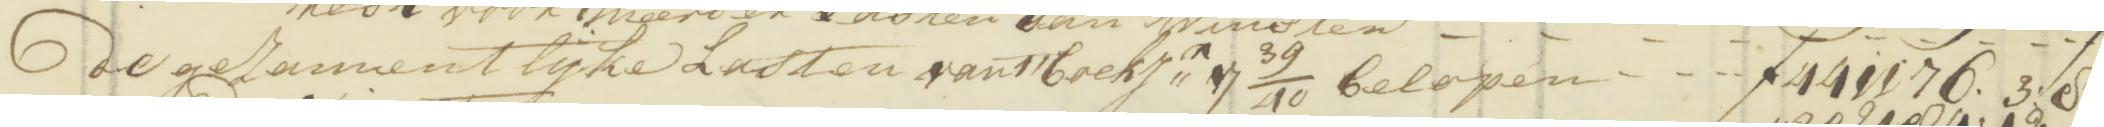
de gezamentlijke Lasten van t' boekj„r 17 39/40 belopen - - - - ƒ441176. 3: 8:
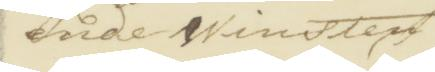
ende winsten
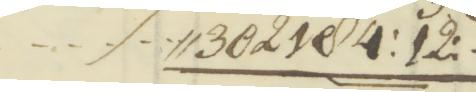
- - - „302184:12:
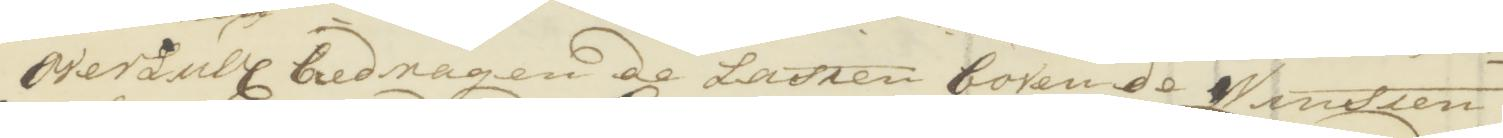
overzulx bedragen de lasten boven de winsten
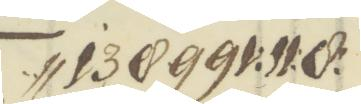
„ 138991:11:8:
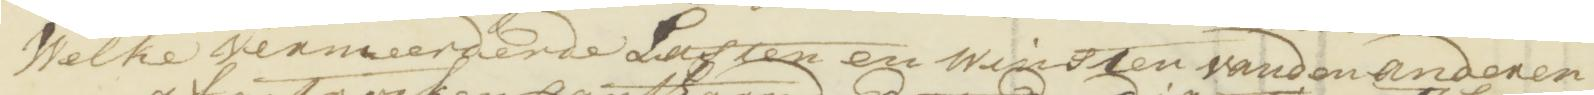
Welke vermeerderde Lasten en winsten vanden anderen
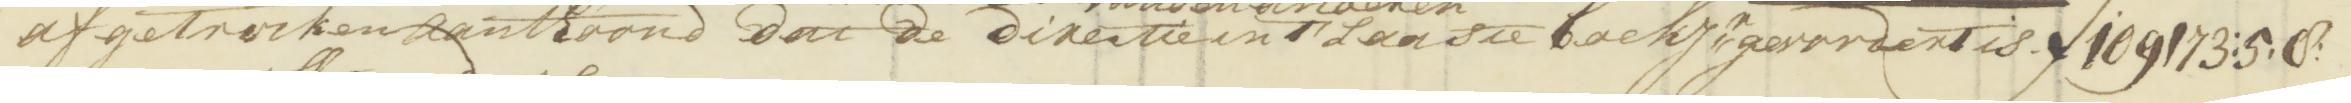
afgetrocken aanthoond dat de directie in t' Laaste boekj„r gevordert is . ƒ109173:5:8:
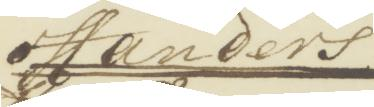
off anders
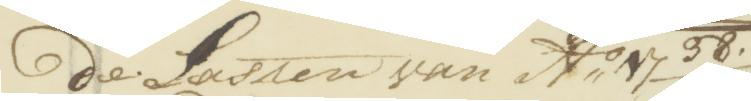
de Lasten van A„o 17
